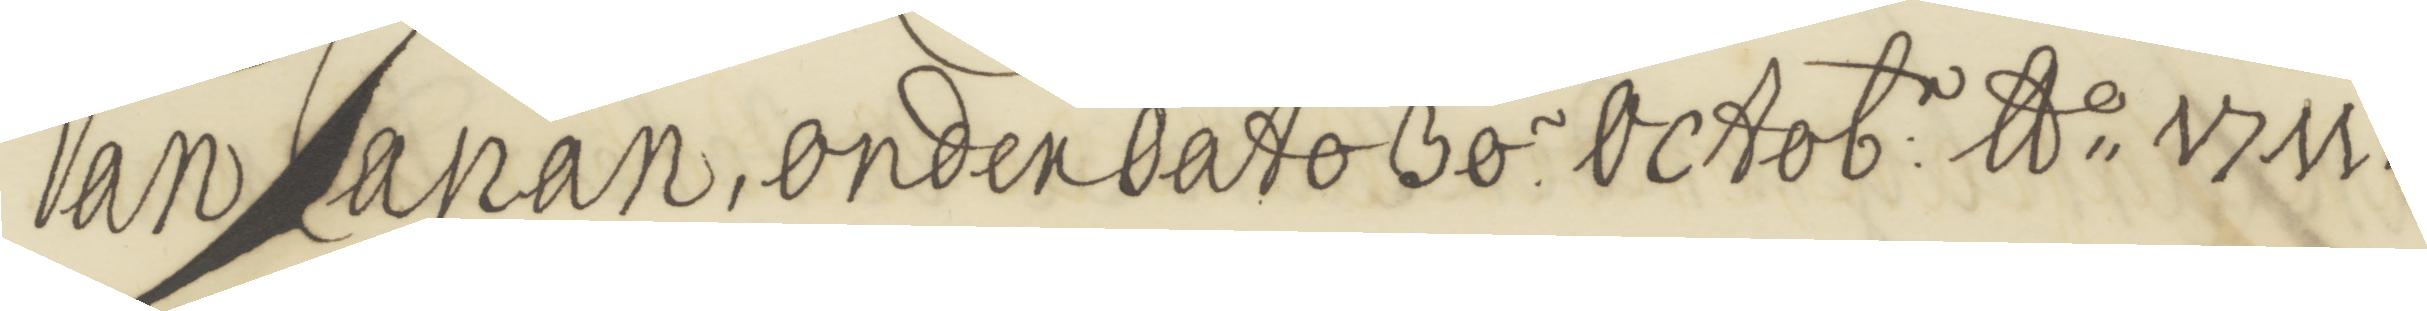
Van Japan, onder dato 30:' Octob:r A„o 1711.
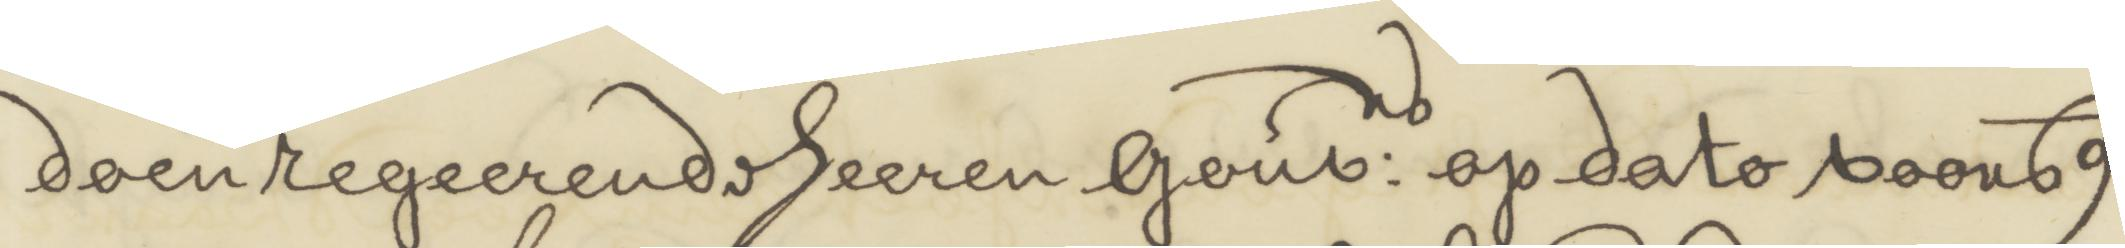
doen regeerende heeren gouv:rs op dato voors
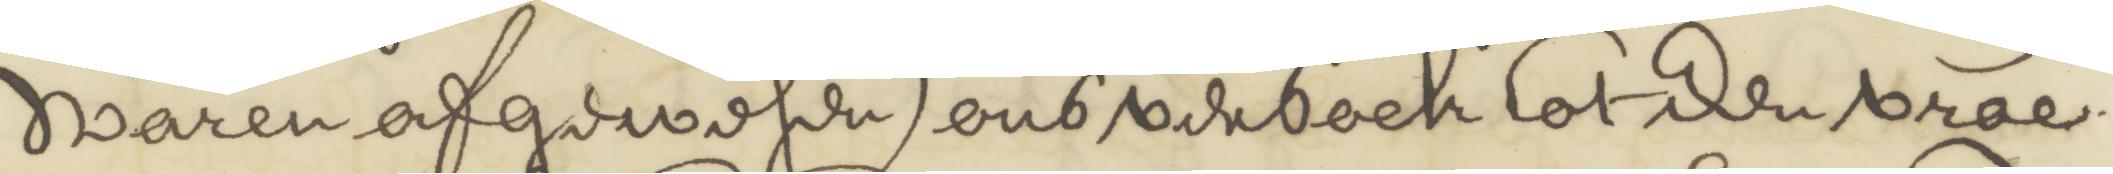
waren afgewesen) ons versoek tot Een vroe
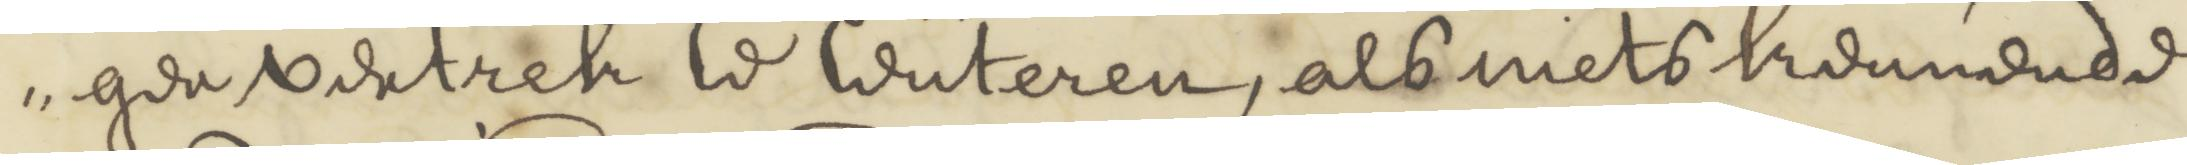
„ger vertrek te tenteren, als niets kennende
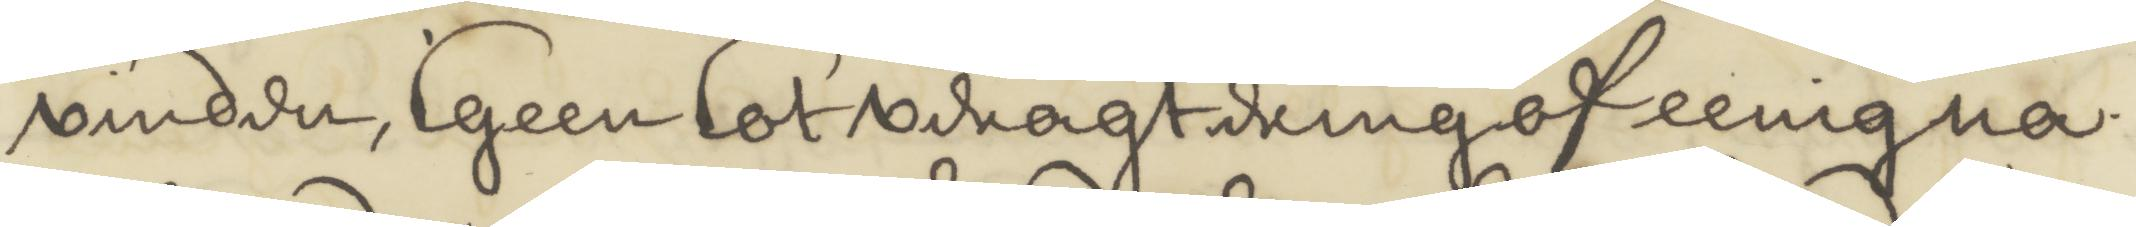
vinden, 'tgeen tot veragtering of eenig na.
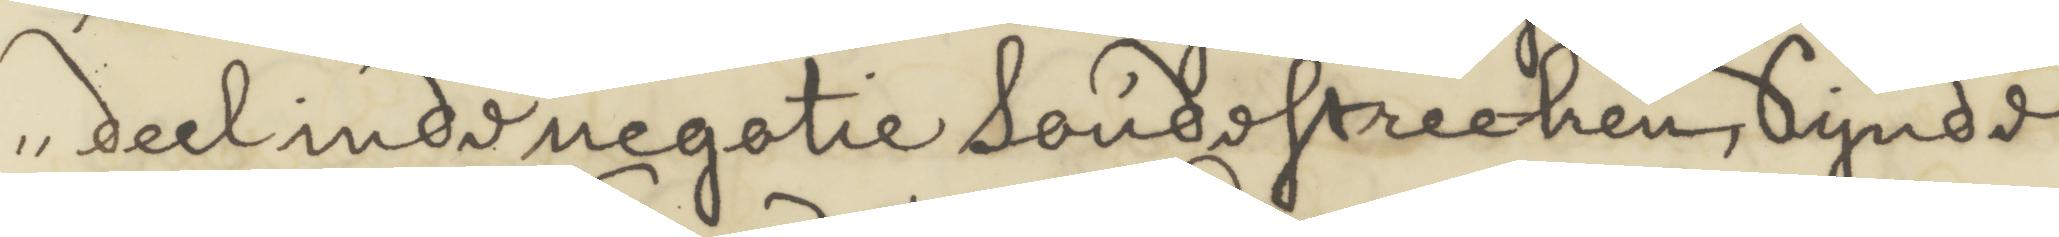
„deel in de negotie soude strecken, sijnde
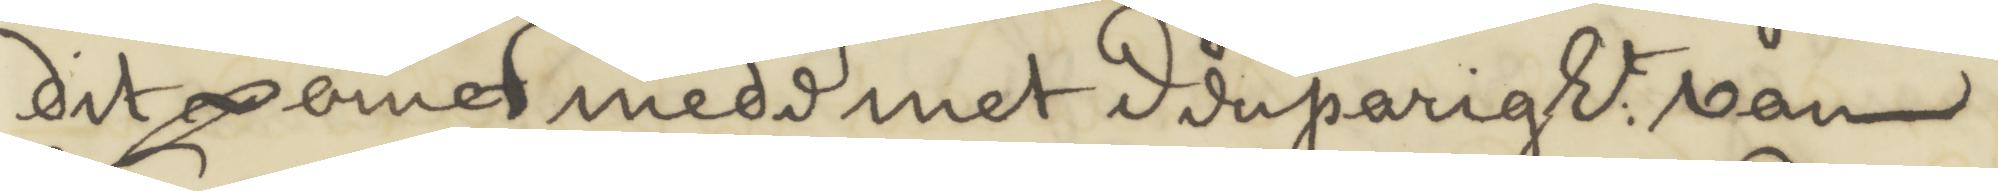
dit permet mede met Eenparigh:t van
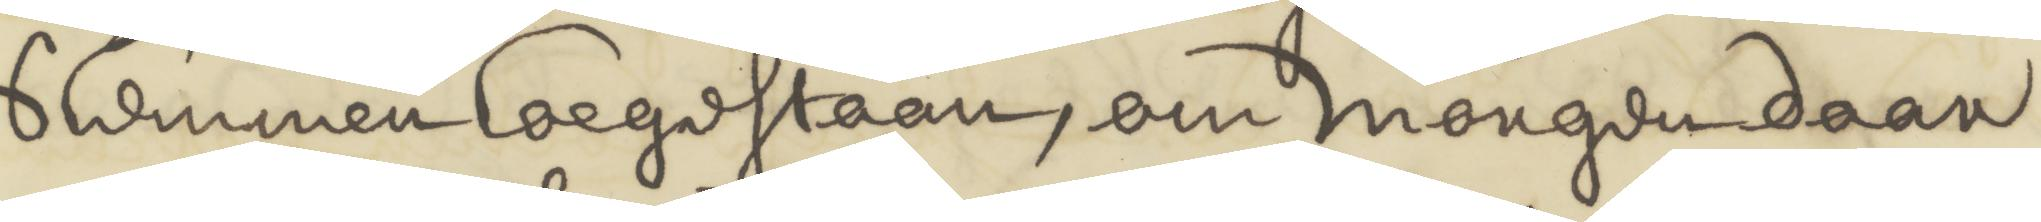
stemmen toegestaan, om morgen daar
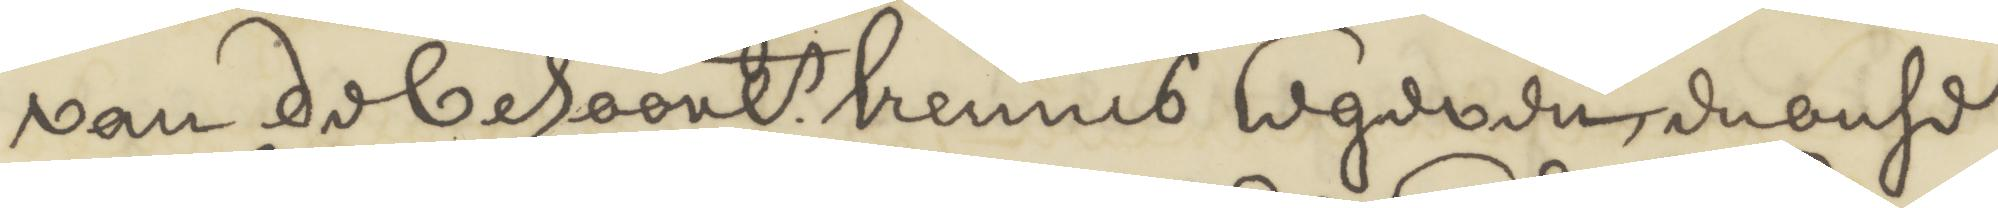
van de behoorlijk. kennis tegeven, en onse
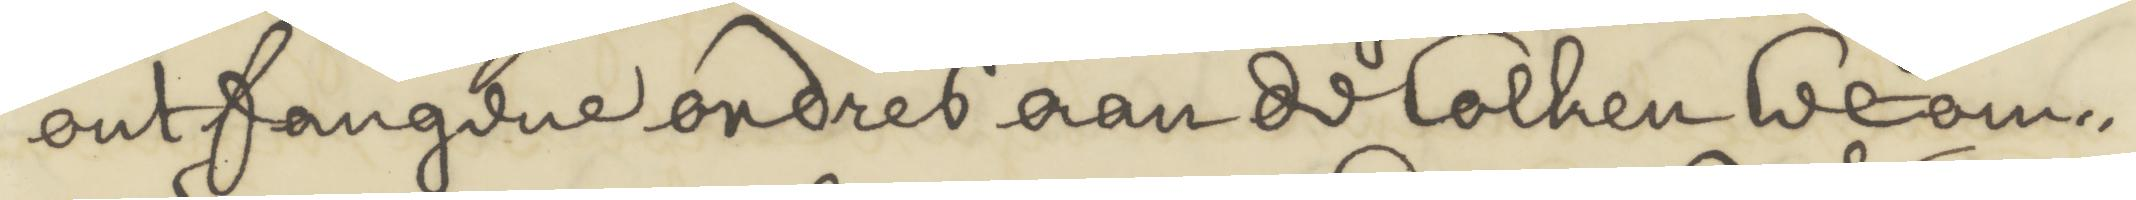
ontfangene ordres aan de tolken te com„
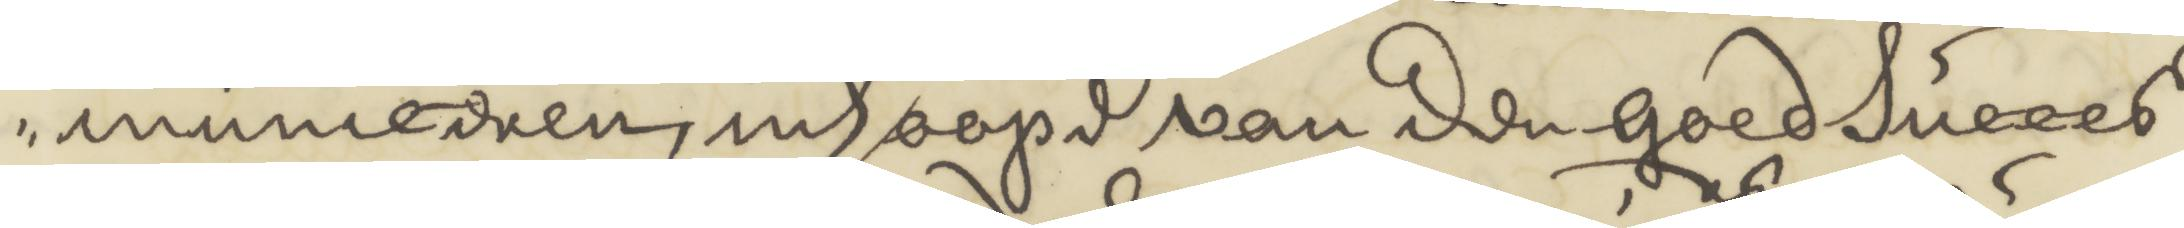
„municeren, inhoope van Een goed succes
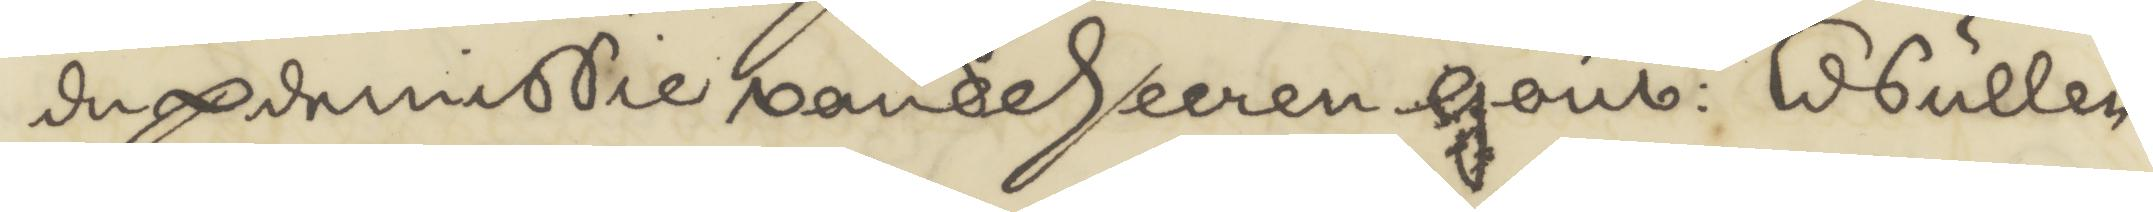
en permissie vande heeren gouv:rs te sullen
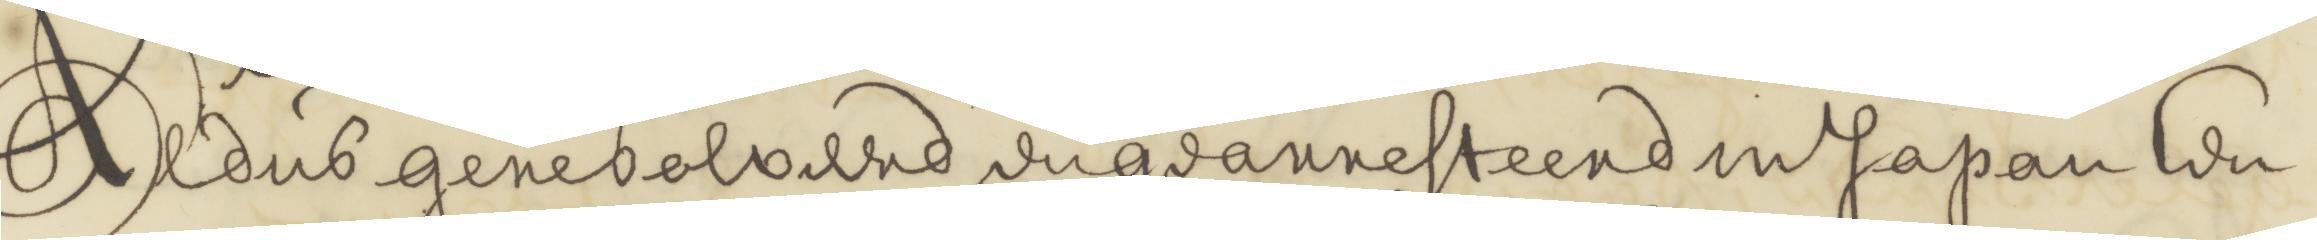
Aldus geresolveerd en gearresteerd in Japan ten
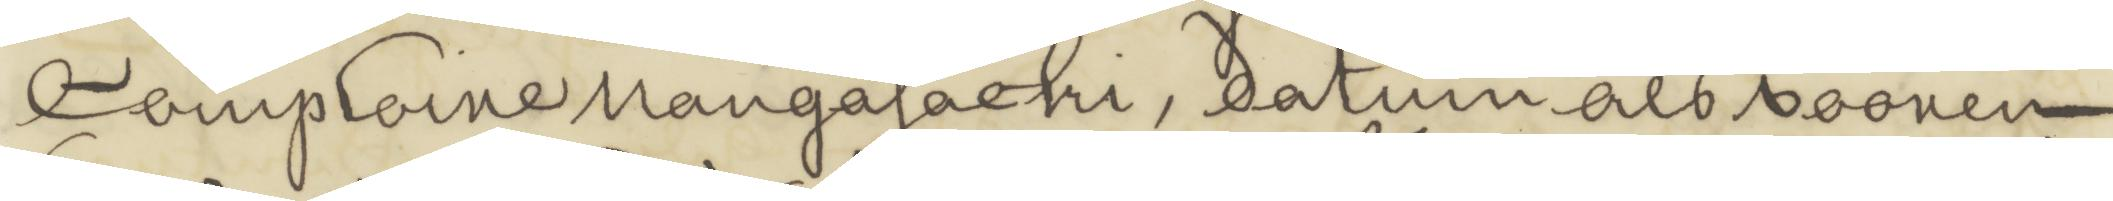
Comptoire nangasacki, datum als vooren
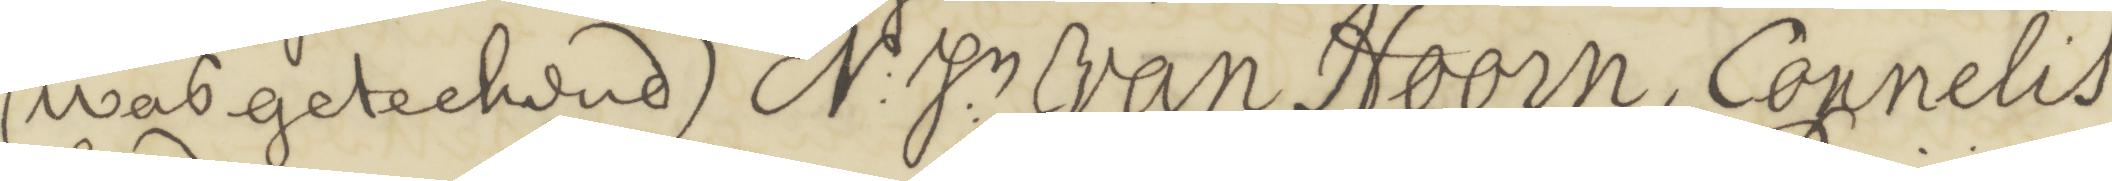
(was geteekend) N: J:n van Hoorn, Cornelis
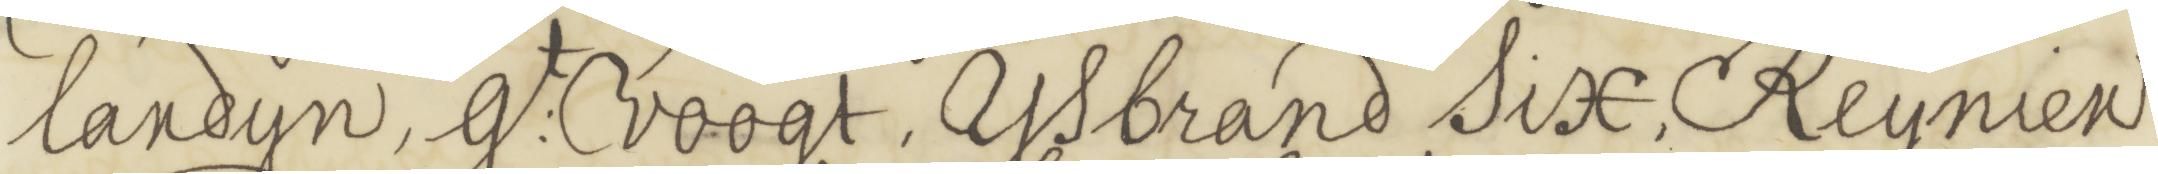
landyn, g:t voogt, Ysbrand Six, Reijnier
